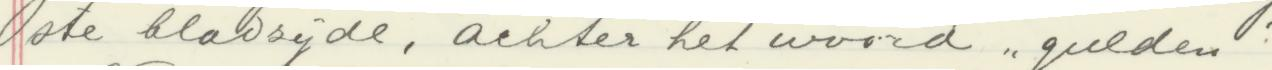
ste bladzijde, achter het woord „ gulden
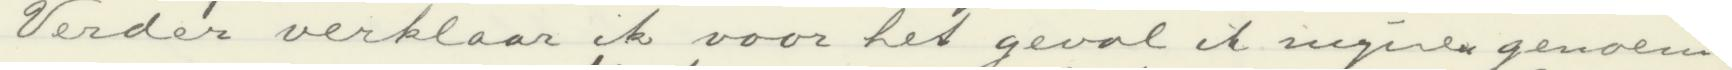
Verder verklaar ik voor het geval ik mijner genoem
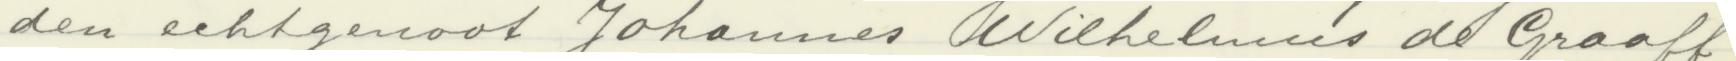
den echtgenoot Johannes Wilhelmus de Graaff
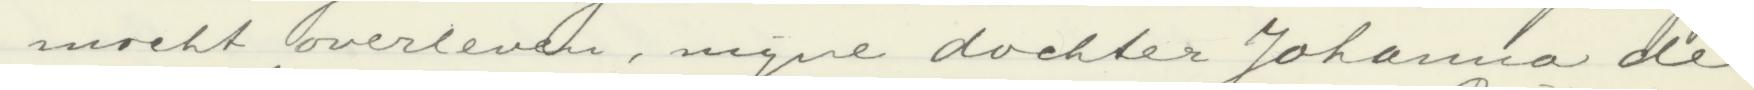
mocht overleven, mijne dochter Johanna de
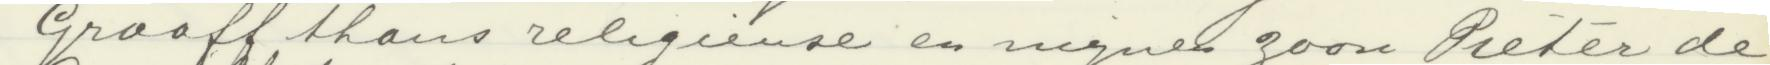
Graaff thans religieuse en mijnen zoon Pieter de
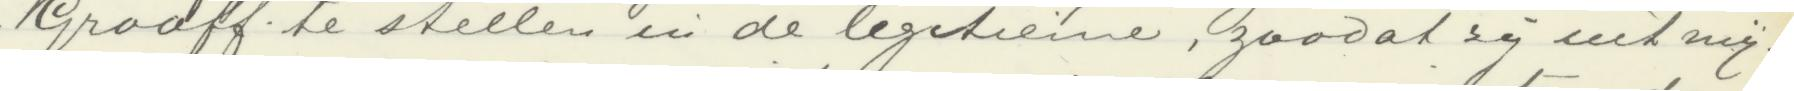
Graaff te stellen in de legitieme, zoodat zij uit mij-
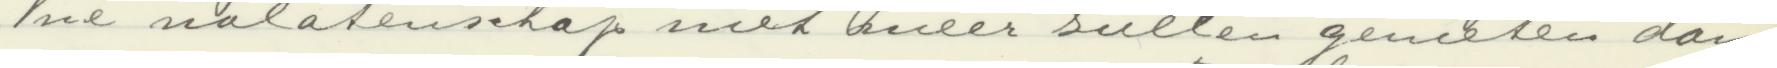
ne nalatenschap niet meer zullen genieten dan
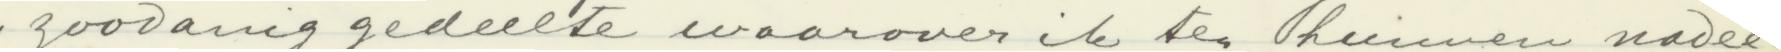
zoodanig gedeelte waarover ik ten hunnen nadee
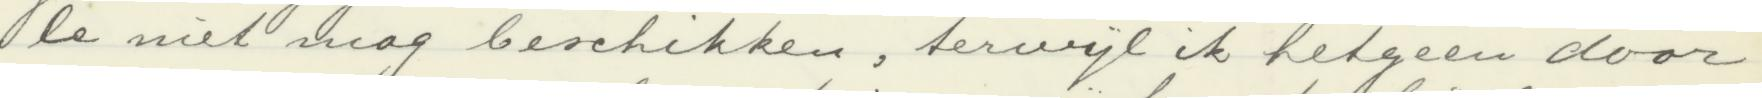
le niet mag beschikken, terwijl ik hetgeen door
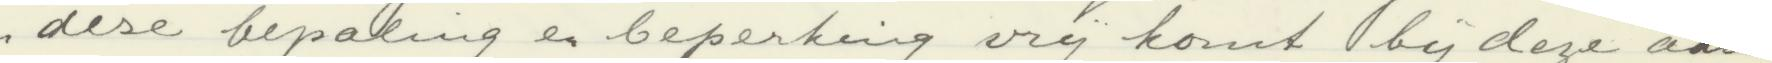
deze bepaling en beperking vrij komt bij deze aan
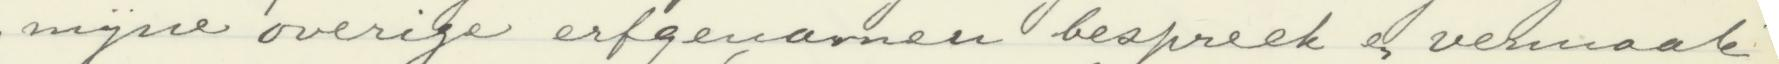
mijne overige erfgenamen bespreek en vermaak"
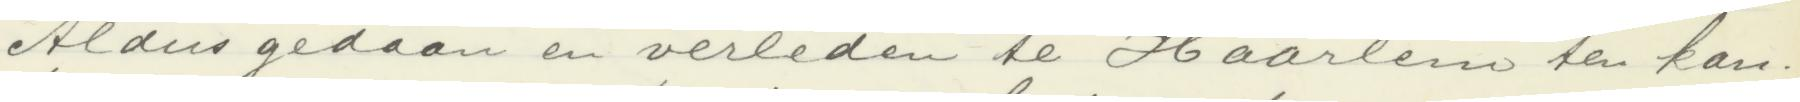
Aldus gedaan en verleden te Haarlem ten kan
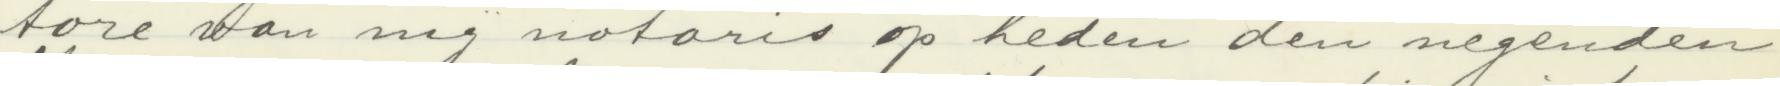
tore van mij notaris op heden den negenden
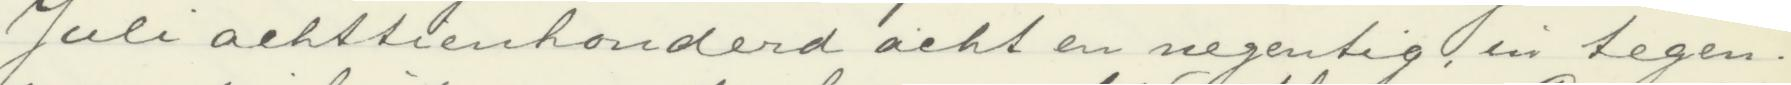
Juli achttienhonderd acht en negentig in tegen
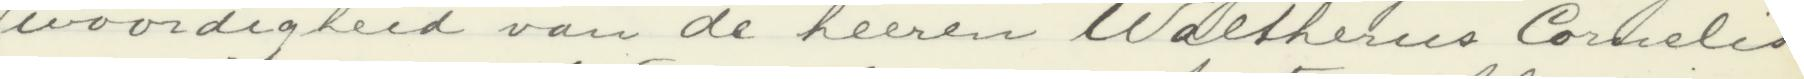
woordigheid van de heeren Waltherus Cornelis
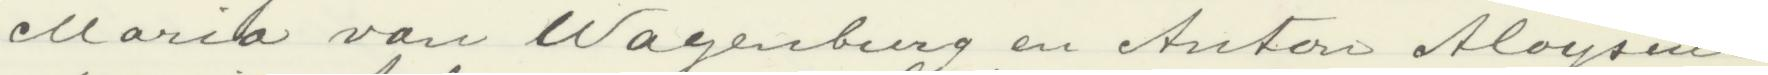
Maria van Wayenburg en Anton Aloysius
